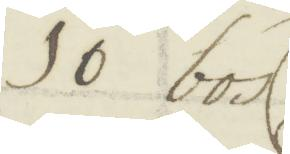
10 bos
